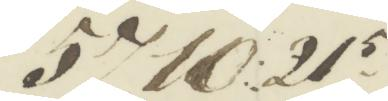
510:21„5
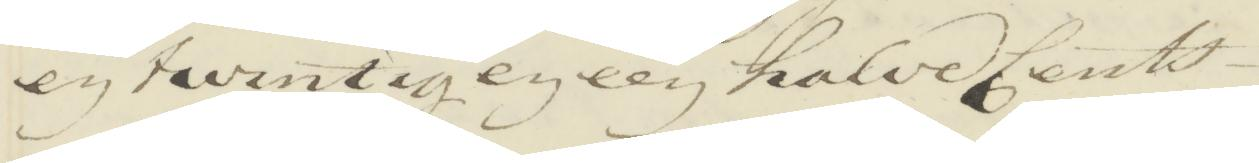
en twintig en een halve Cents-
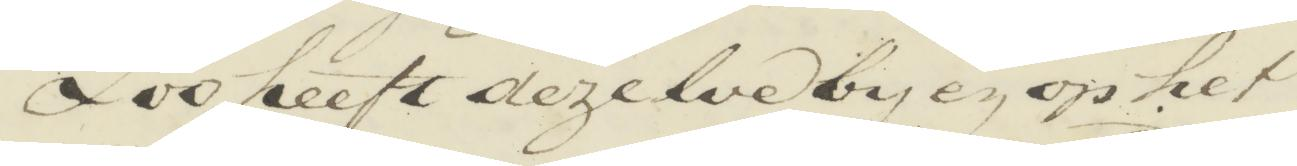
zoo heeft dezelve by en op het
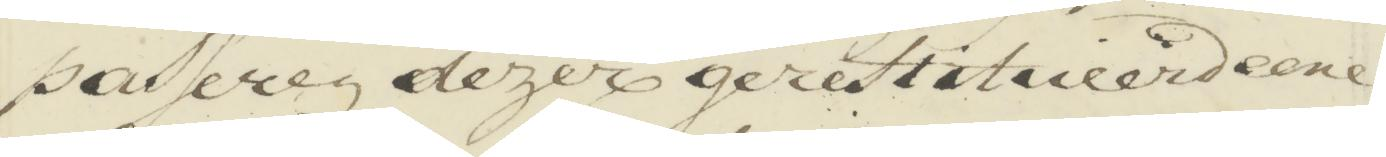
passeren dezer gerestitueerd eene
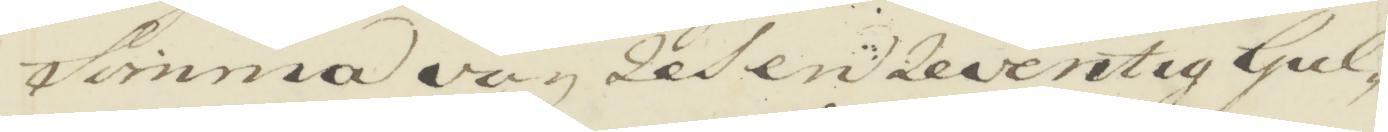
Somma van Zes en Zeventig Gul
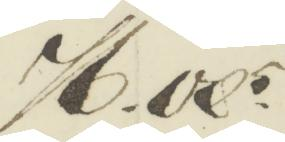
76.08„5
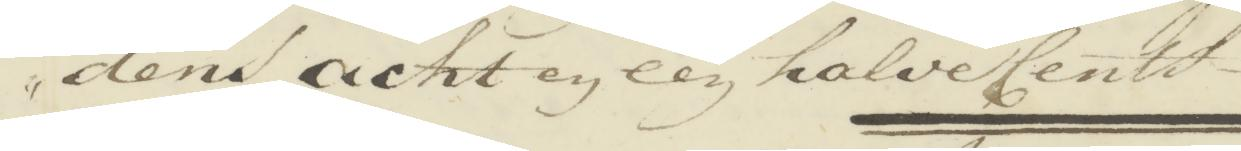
„dens acht en een halve Cents
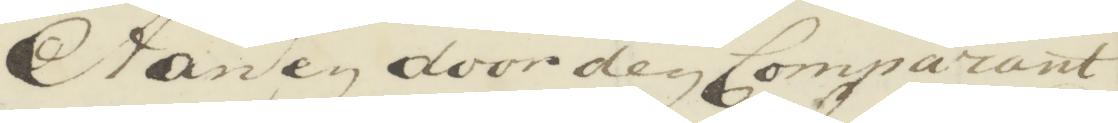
Aan en door den Comparant
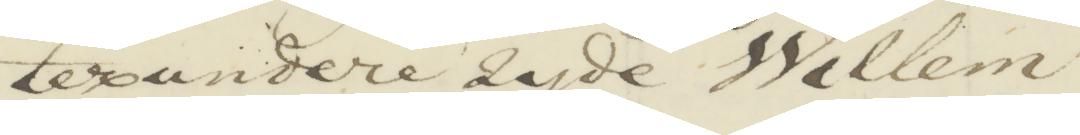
ter andere zyde Willem
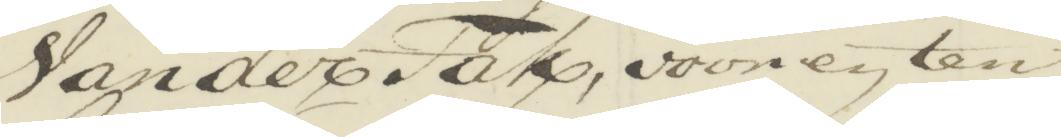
van der Tak, voor en ten
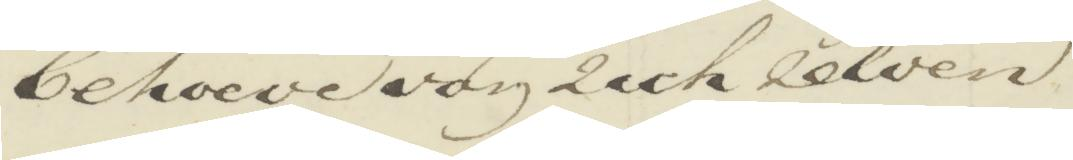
behoeve van zich zelven
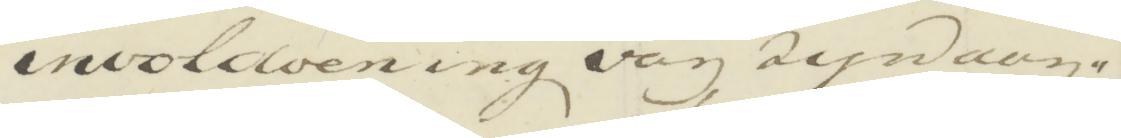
involdoening van zyn aan„
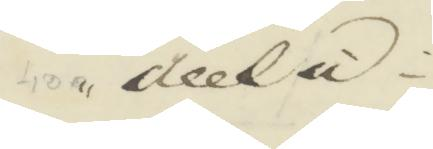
deel à -
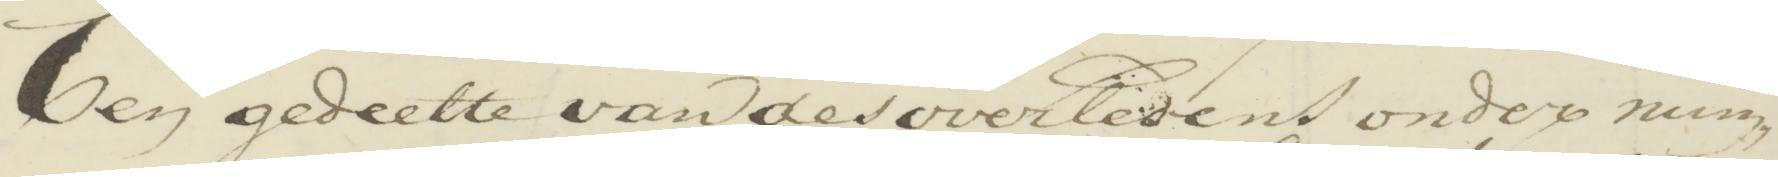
Een gedeelte van des overledens onder num„
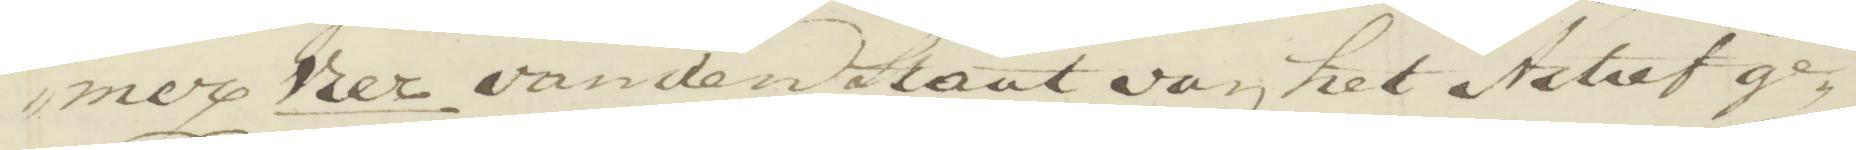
„mer Vier van den staat van het Actief ge„
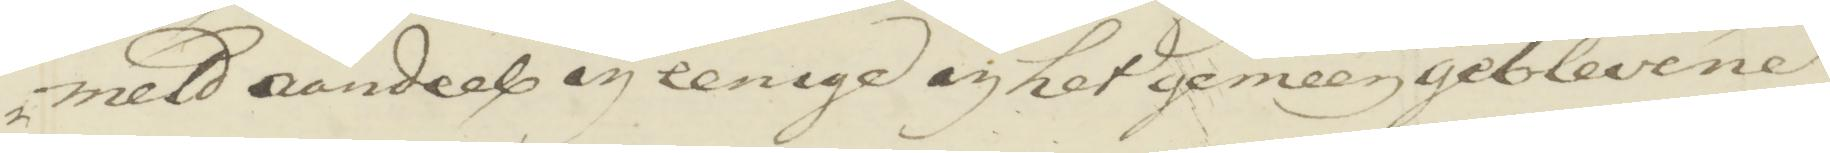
„meld aandeel in eenige in het gemeen geblevene
